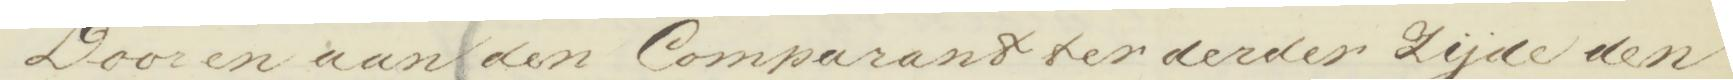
Door en aan den Comparant ter derder zijde den
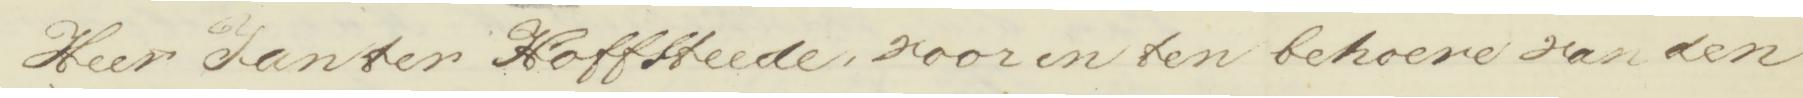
Heer Ian ter Hoffsteede, voor en ten behoeve van den
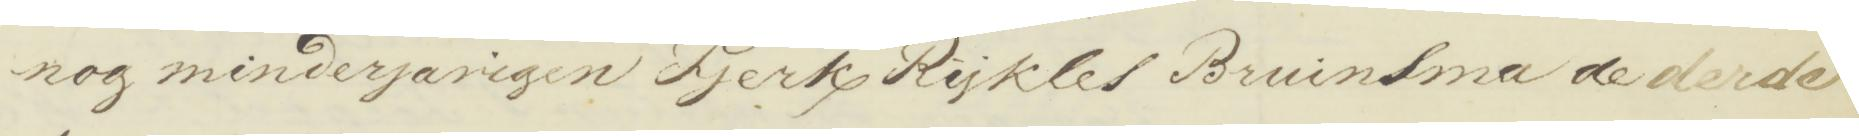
nog minderjarigen Tjerk Rijkles Bruinsma de derde
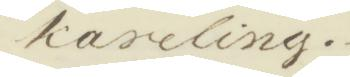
kaveling.
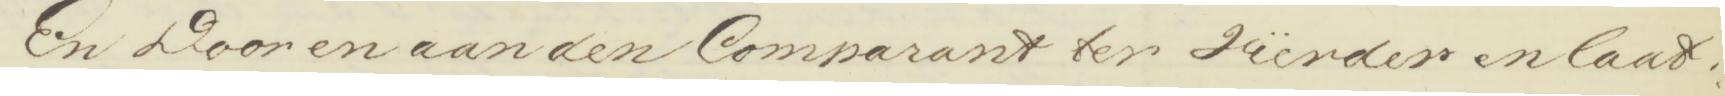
En Door en aan den Comparant ter Vierder en laat,
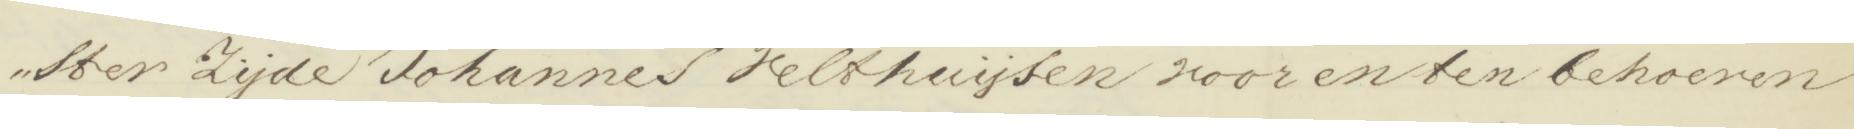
„ster zijde Iohannes Velthuijsen voor en ten behoeven
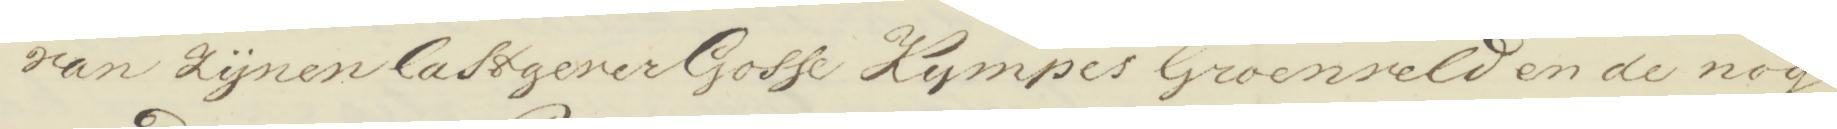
van zijnen lastgever Gosse Kympes Groenveld en de nog
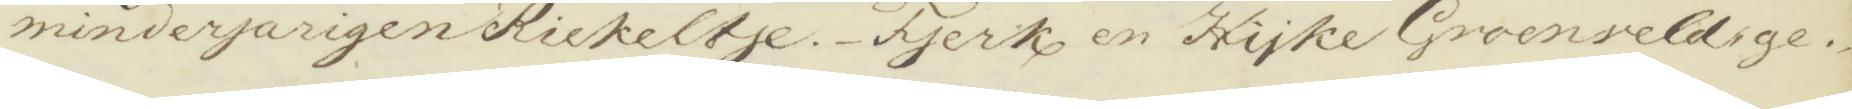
minderjarigen Riekeltje. - Tjerk en Hijke Groenveld, ge.
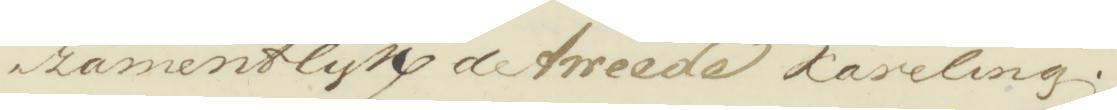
„zamentlyk de tweede kaveling.
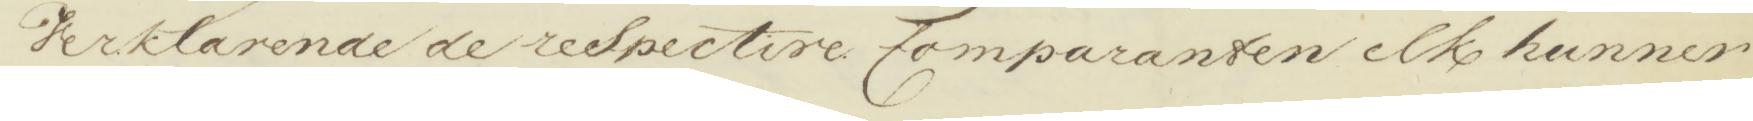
Verklarende de respective Comparanten elk hunner
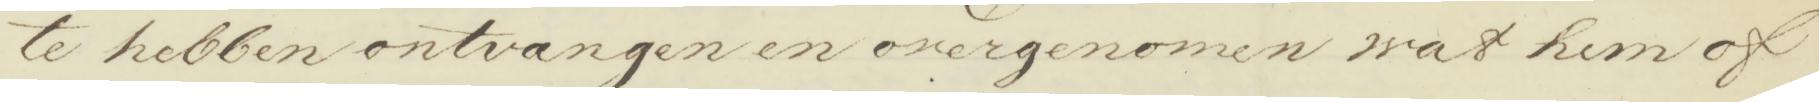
te hebben ontvangen en overgenomen wat hem of
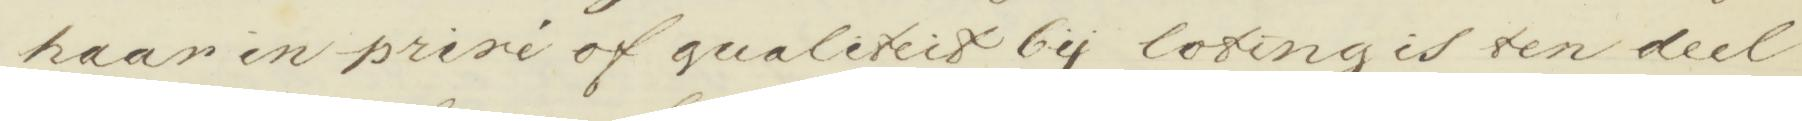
haar in privé of qualiteit bij loting is ten deel
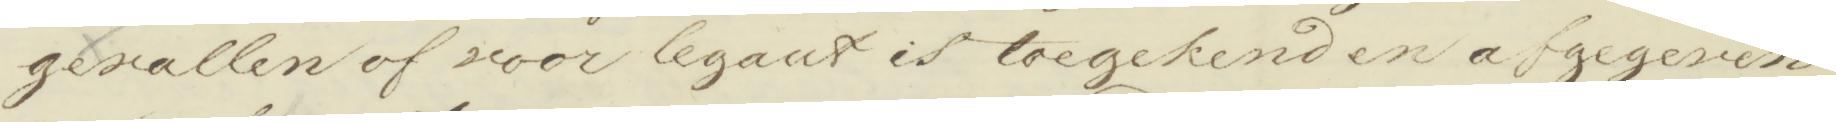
gevallen of voor legaat is toegekend en afgegeven
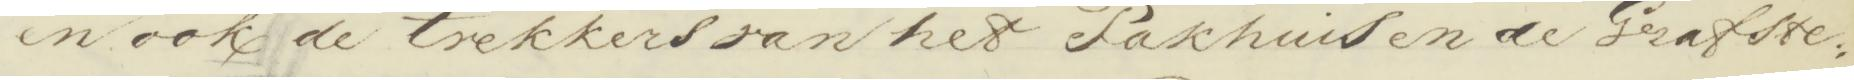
en ook de trekkers van het Pakhuis en de Grafste.
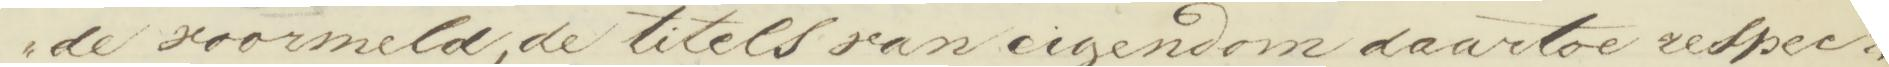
„de voormeld, de titels van eigendom daartoe respec„
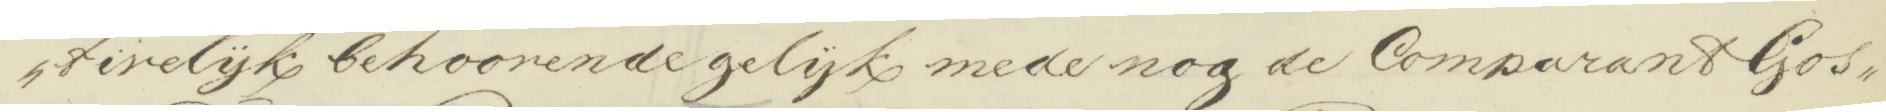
„tivelijk behoorende gelijk mede nog de Comparant Gos„
